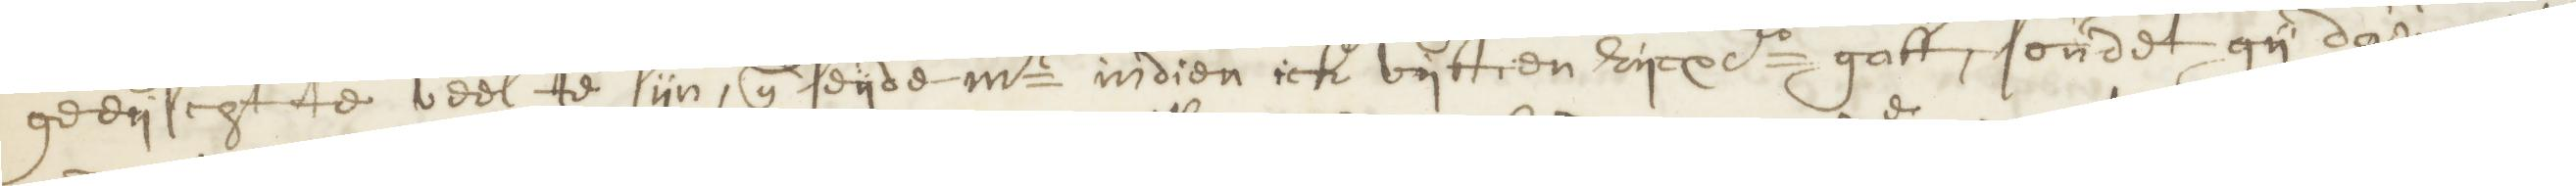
geeijscht te veel te sijn, ende seijde m=r indien ick vijftien rijcxd=rs gaff, soudet gij daer niet
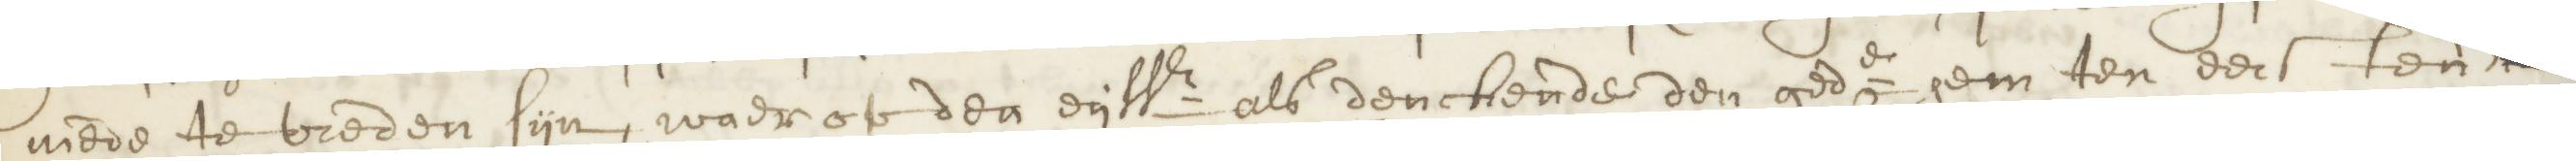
mede te vreden sijn, waer op den eijss=r als denckende den ged=e hem ten eersten te
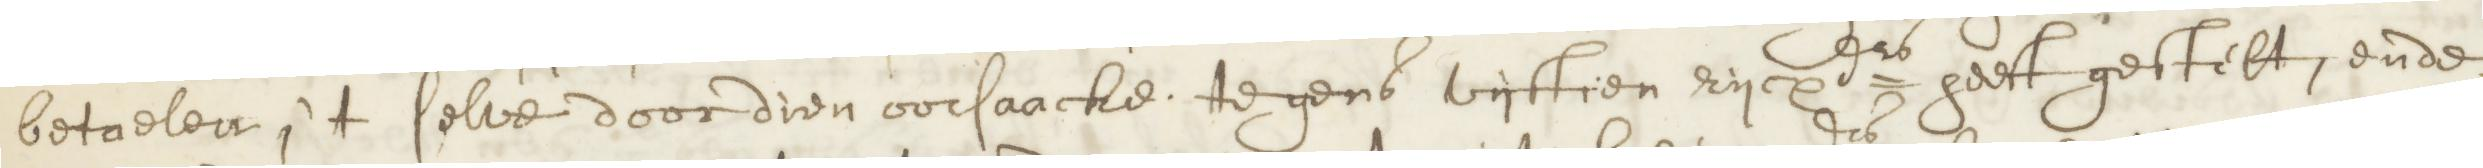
betaelen, ’t selve door dien oorsaacke tegens vijftien rijcxd=rs heeft gestelt, ende
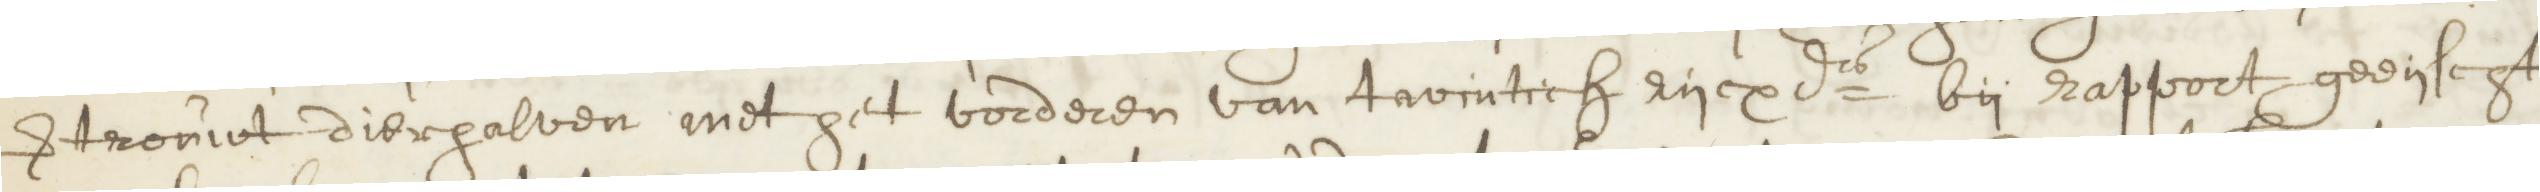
vertrouwt dierhalven met het vorderen van twintich rijcxd=rs bij rapport geeijscht
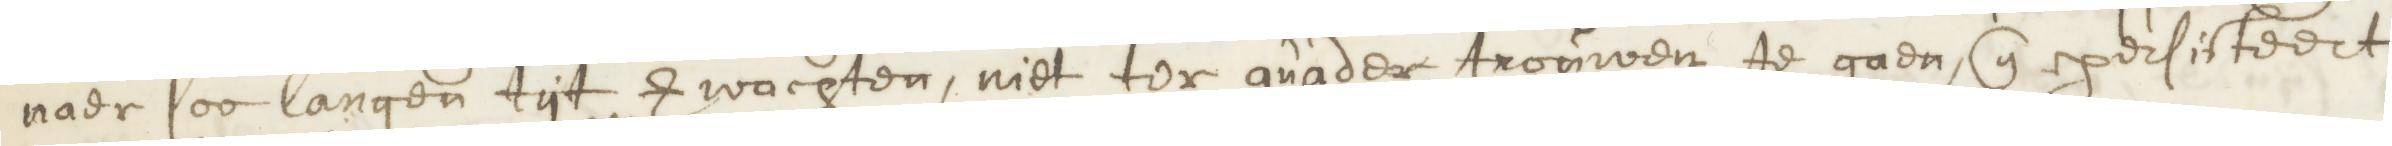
naer soo langen tijt verwachten, niet ter quader trouwen te gaen, ende persisteert
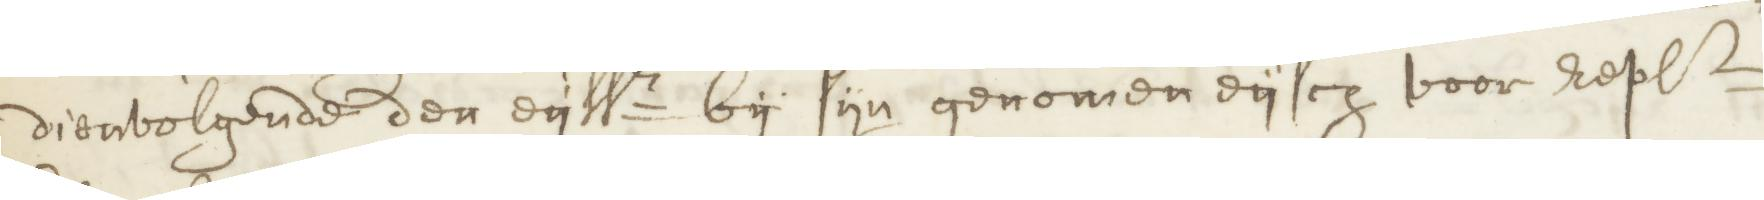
dienvolgende den eijss=r bij sijn genomen eijsch voor replijk
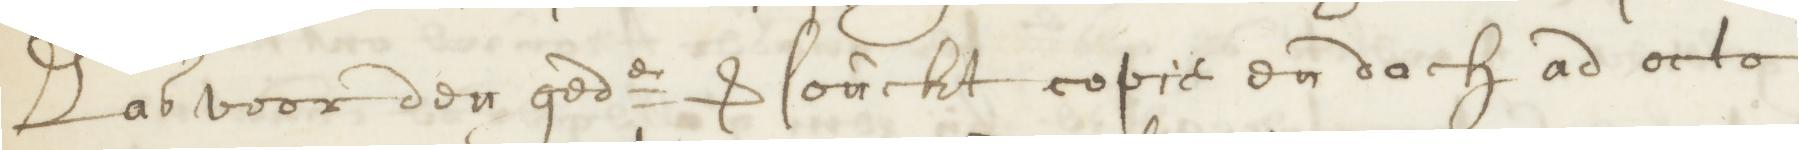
Zas voor den ged=e versouckt copie en dach ad octo
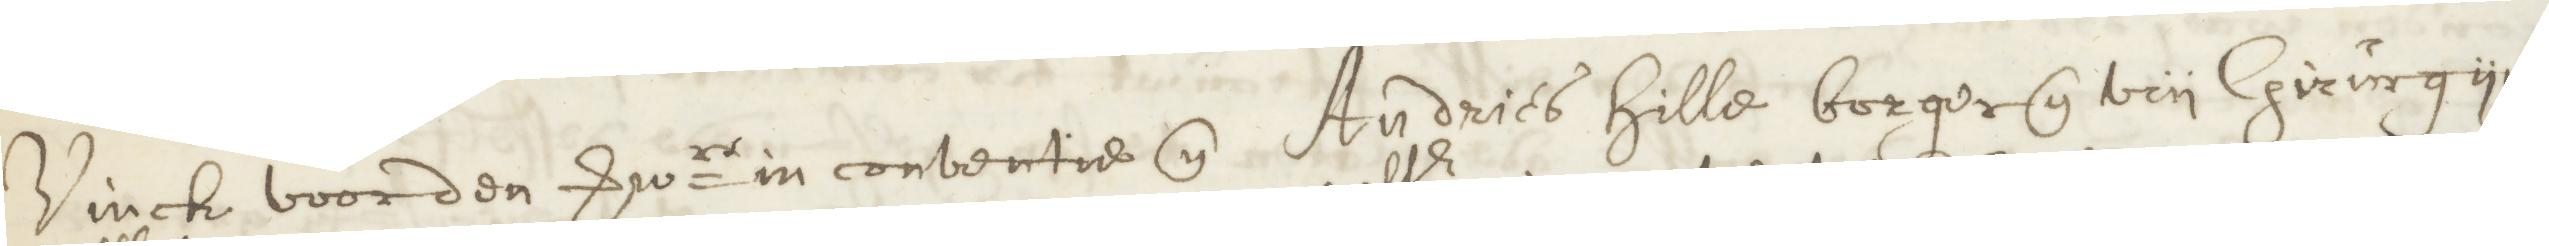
Vinck voor den verw=re in conventie ende Andries hille borger ende vrij Chirurgijn
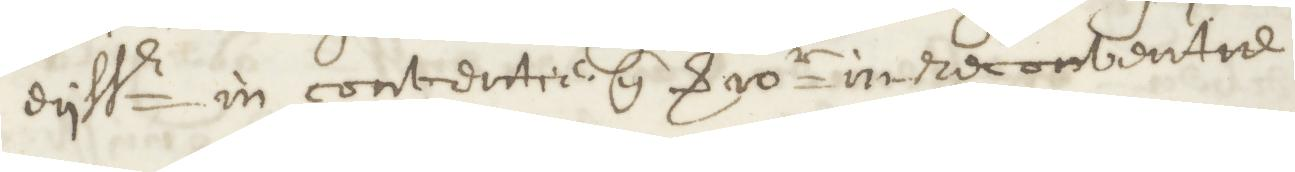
eijss=r in conventie ende verw=r in reconventie
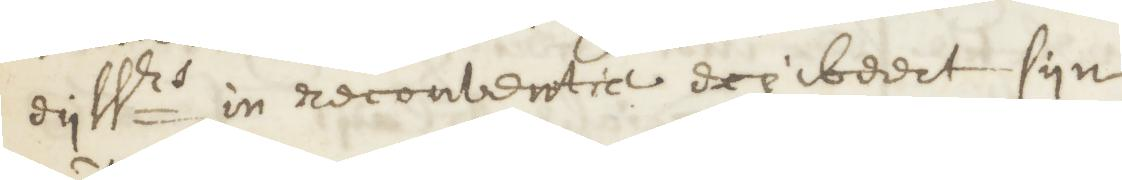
eijss=r in reconventie exhibeert sijn
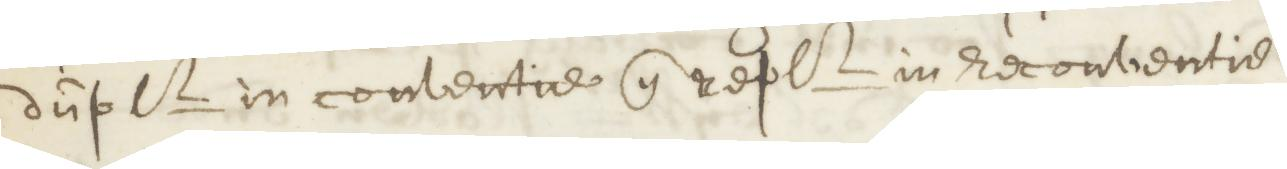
duplijk in conventie ende replijk in reconventie
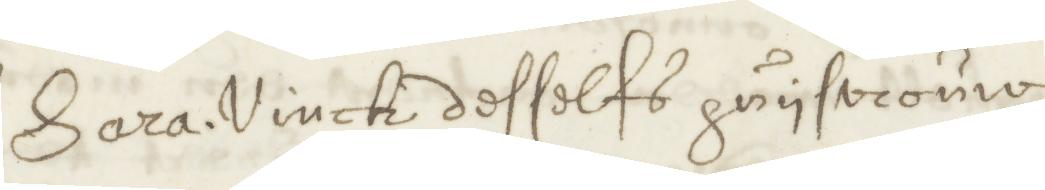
Sara Vinck desselfs huijsvrouw
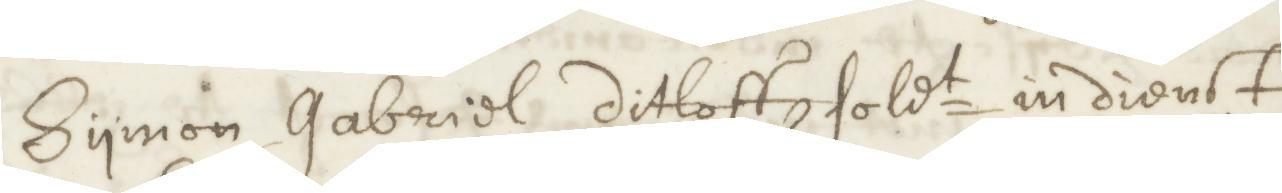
Sijmon Gabriel ditloff sold=t in dienst
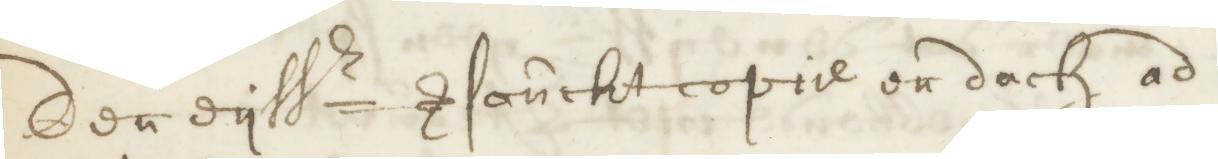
den eijss=r versouckt copie en dach ad
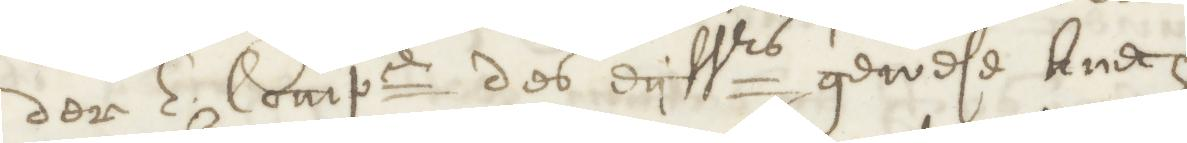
der E: Comp=e des eijss=r gewese knegt
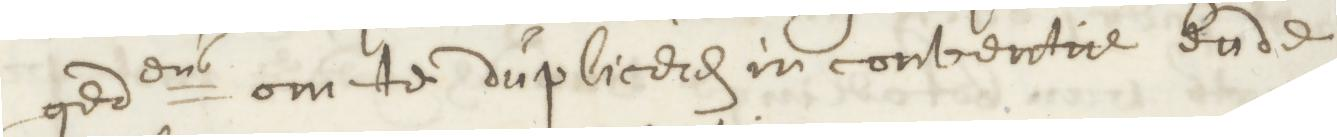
ged=ens om te dupliceren in conventie ende
